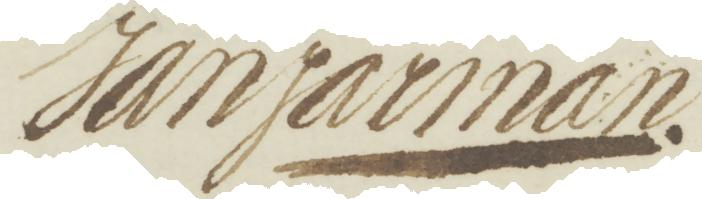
Jan Jarman.
